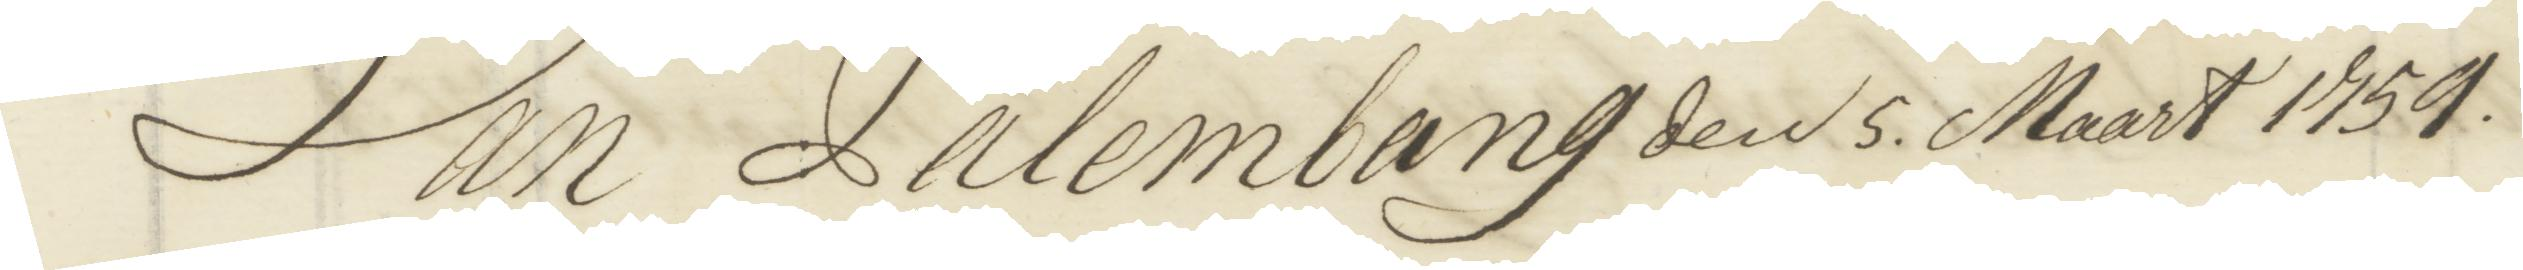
Van Palembang den 5. Maart 1754.
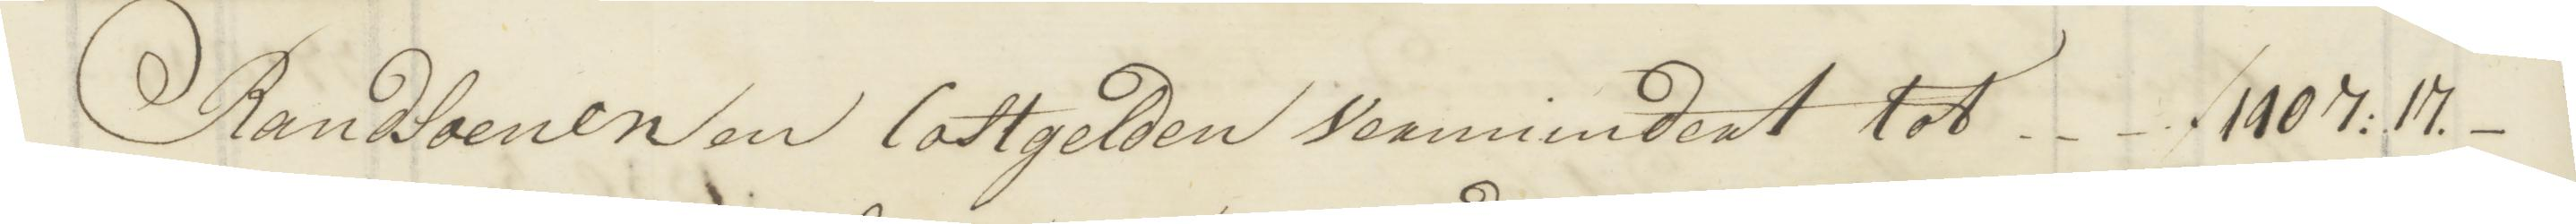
Randsoenen en Costgelden vermiindert tot - - - - ƒ 1407: 17. —
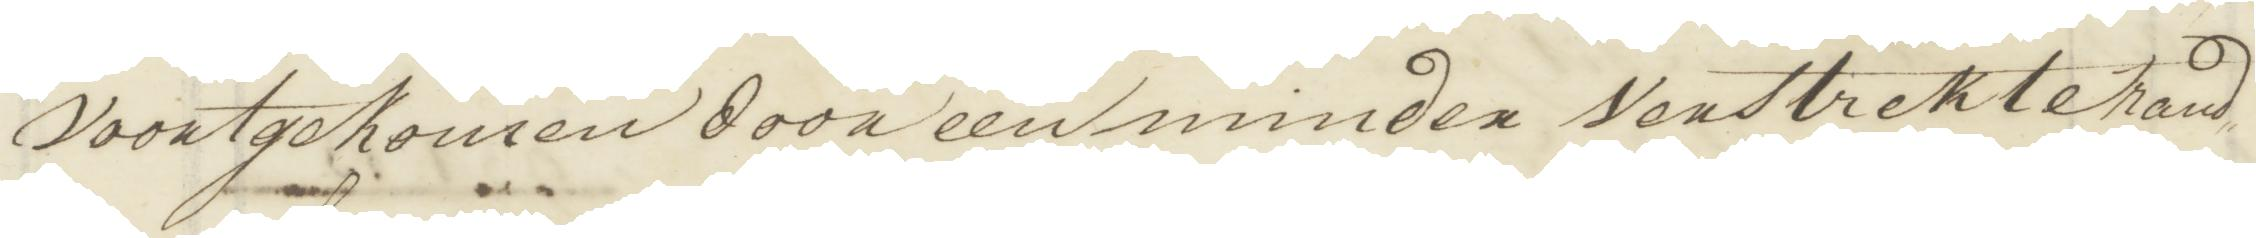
voortgekomen door een minder verstrekte rand„
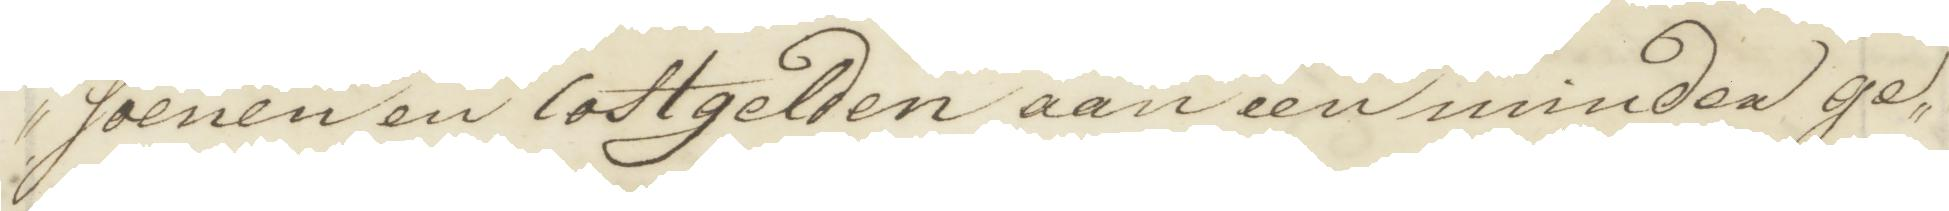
„soenen en Costgelden aan een minder ge„
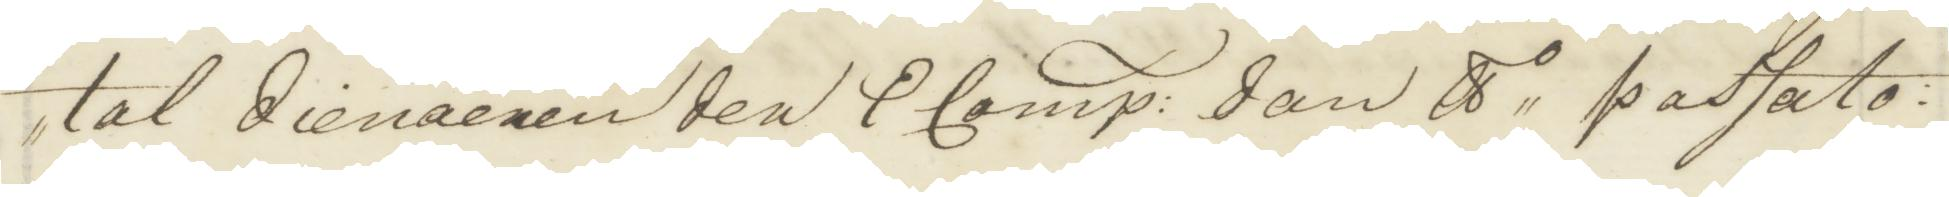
„tal dienaeren den E Comp: dan A„o passato:
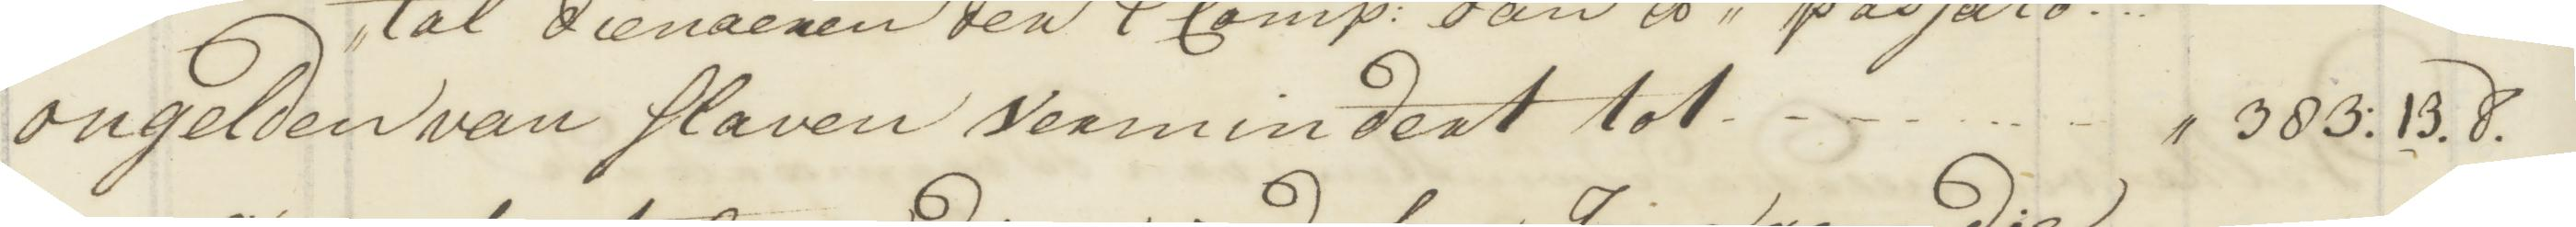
ongelden van slaven vermindert tot - - - - - - - - „ 383: 13. 8.
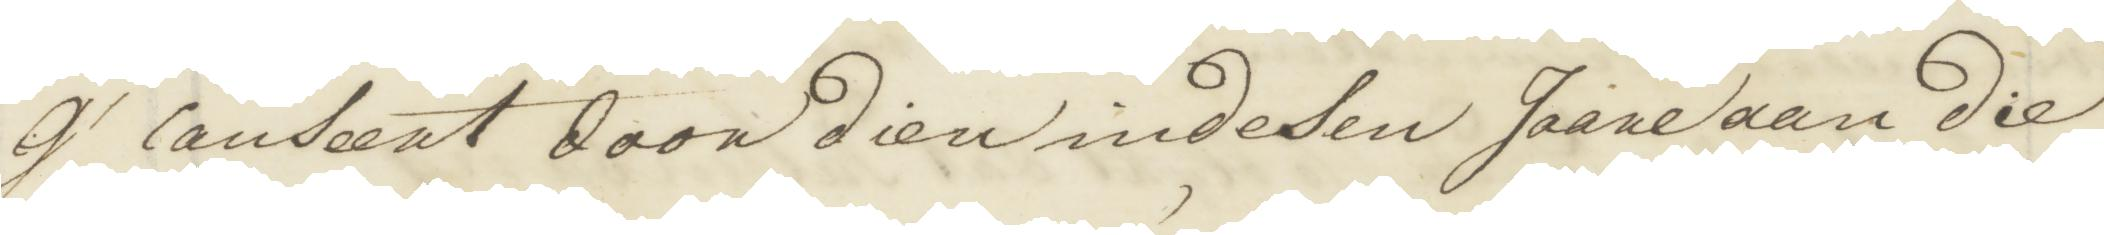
g’ causeert door dien indesen Jaare aan die
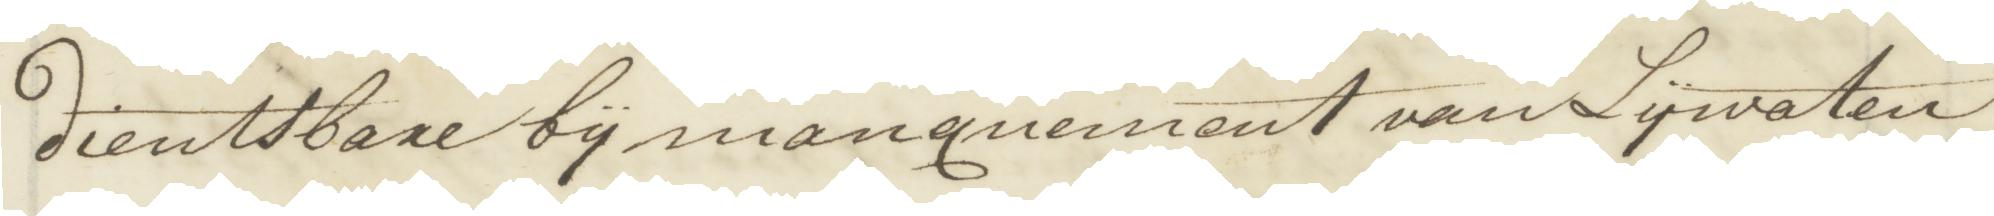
dientsbare bij manquement van Lijwaten
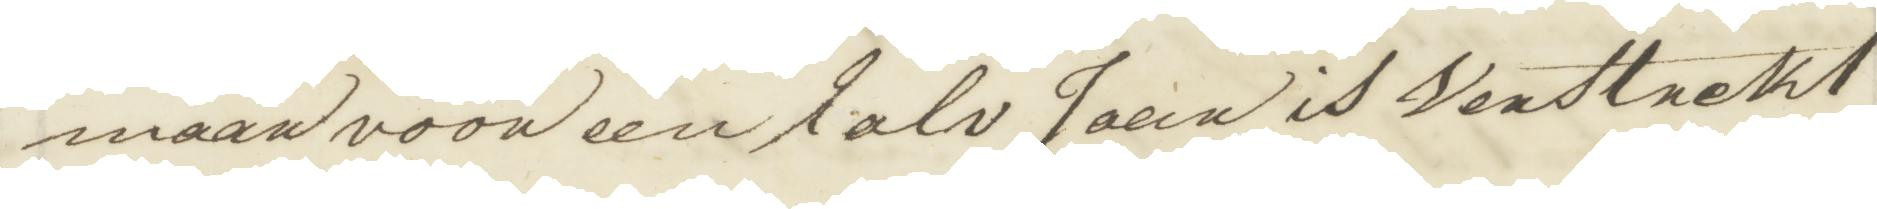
waar voor een halv Jaar is Verstrekt
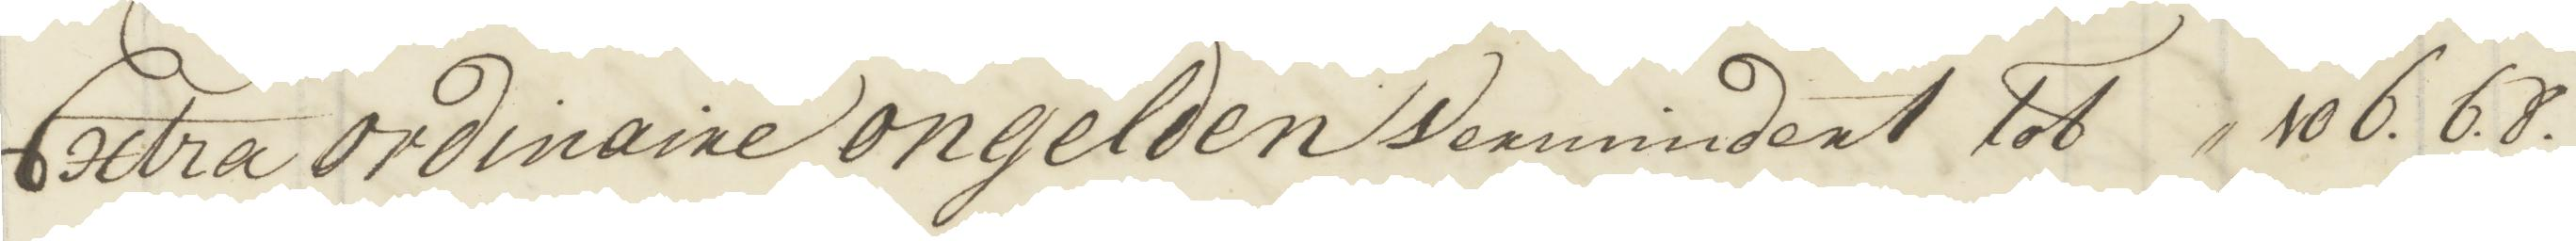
Extra ordinaire ongelden Vermindert tot „ 106. 6. 8.
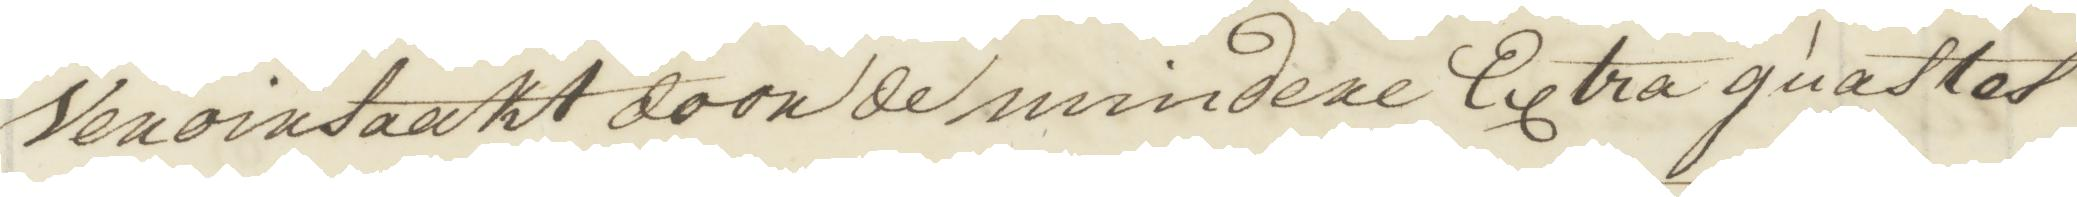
Veroirsaakt door de mindere Extra guastes
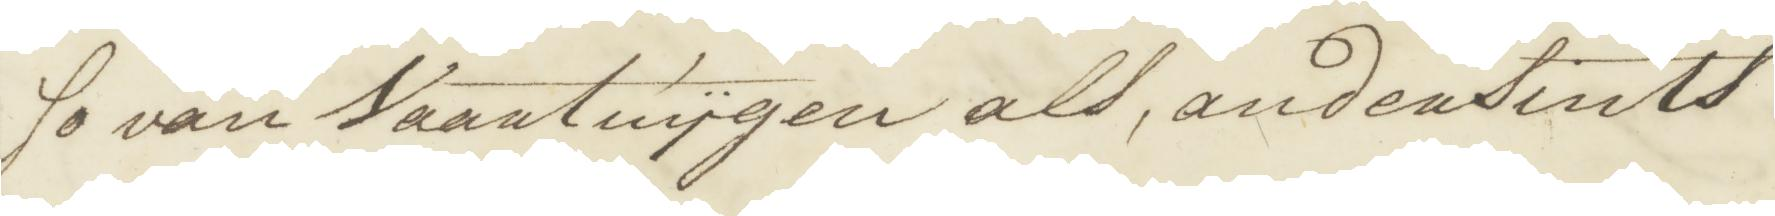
so van Vaartuijgen als, andersints
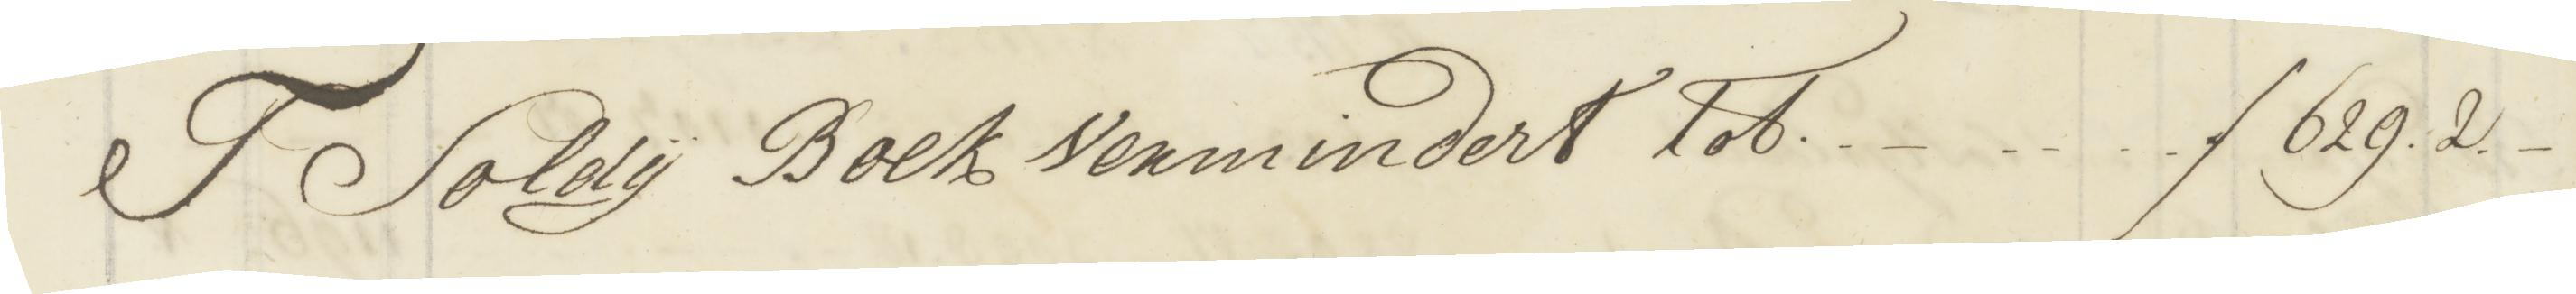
T Soldij Boek vermindert tot - - - - - - - ƒ 629. 2. —
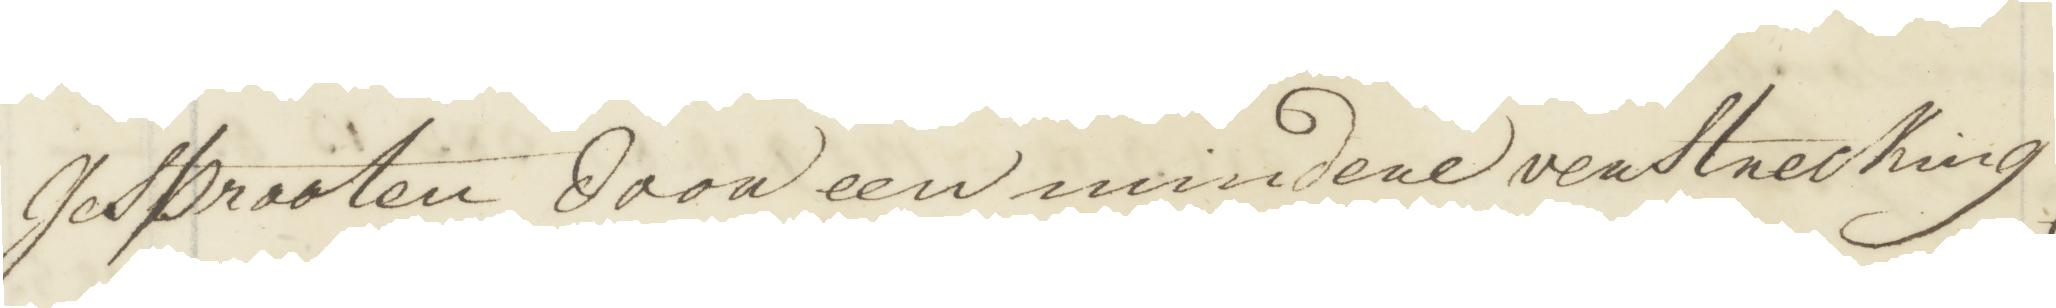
gesprooten door een mindere verstrecking
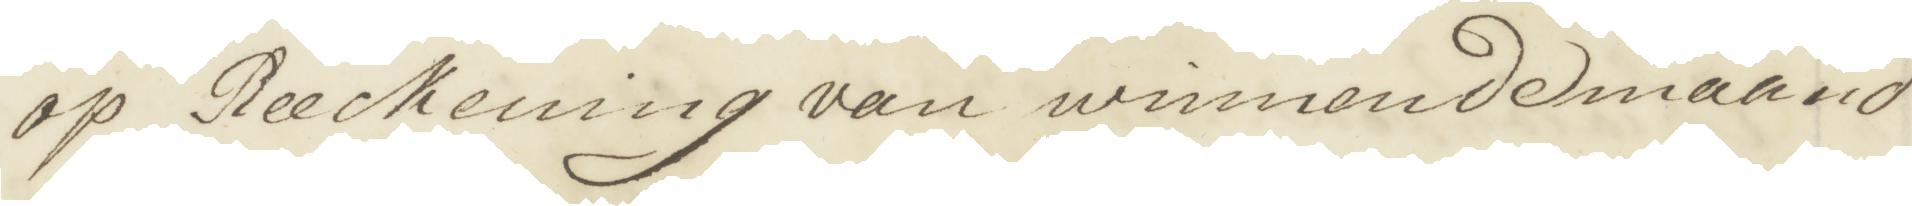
op Reeckening van winnende maand
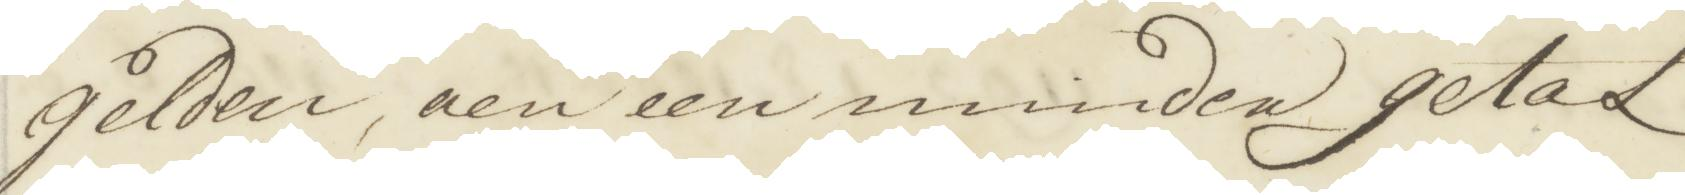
gelden, aen een minder getal
